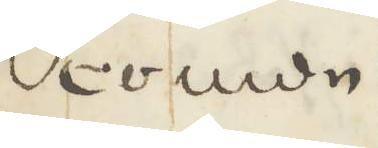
comen
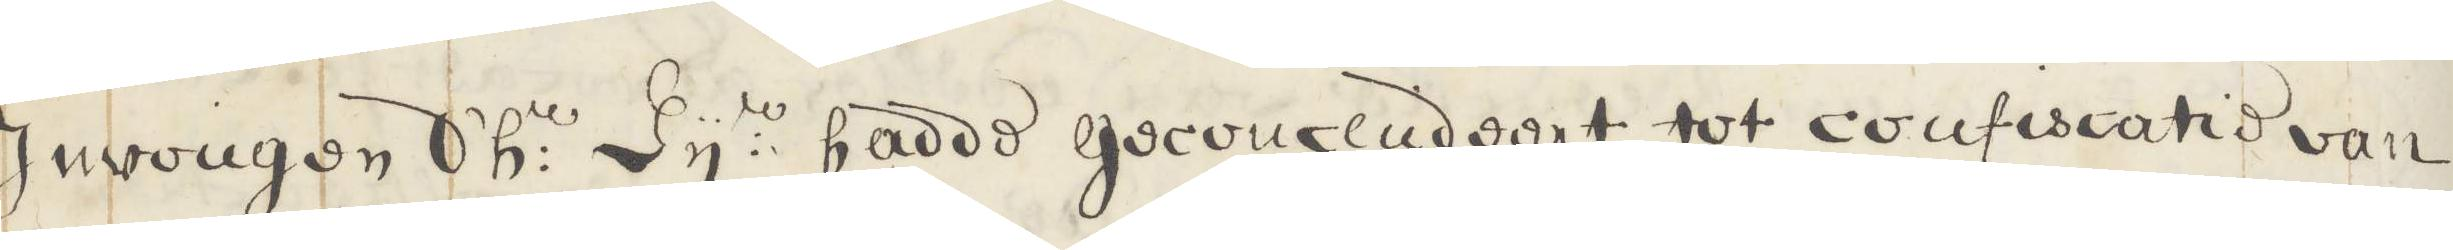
Jnvougen d' h:r Eij:r hadde geconcendeert tot confiscatie van
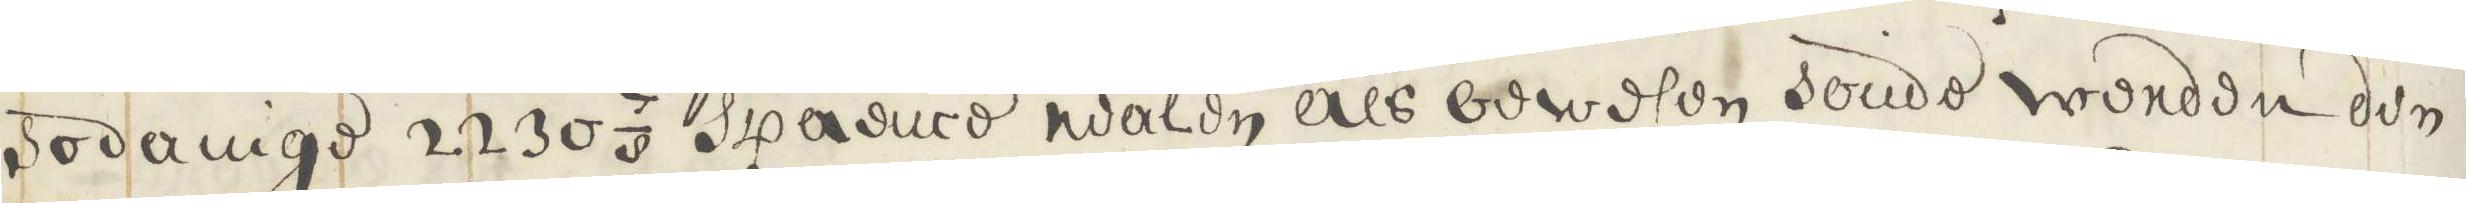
sodanige 2230 7/8 spaence realen als bewesen soude werden den
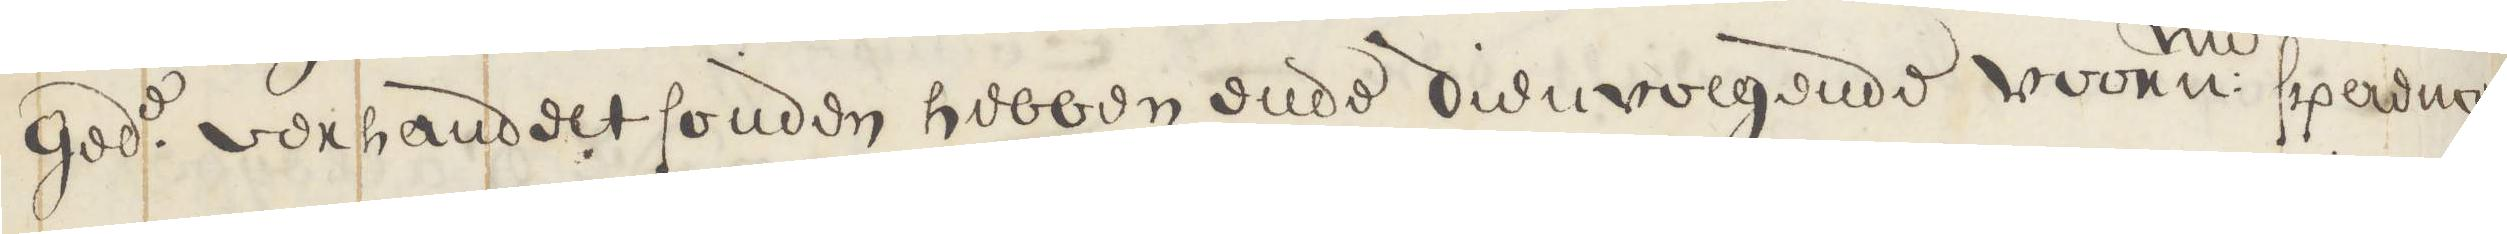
ged.e verhandelt souden hebben ende dienvoegende voorn: spaence
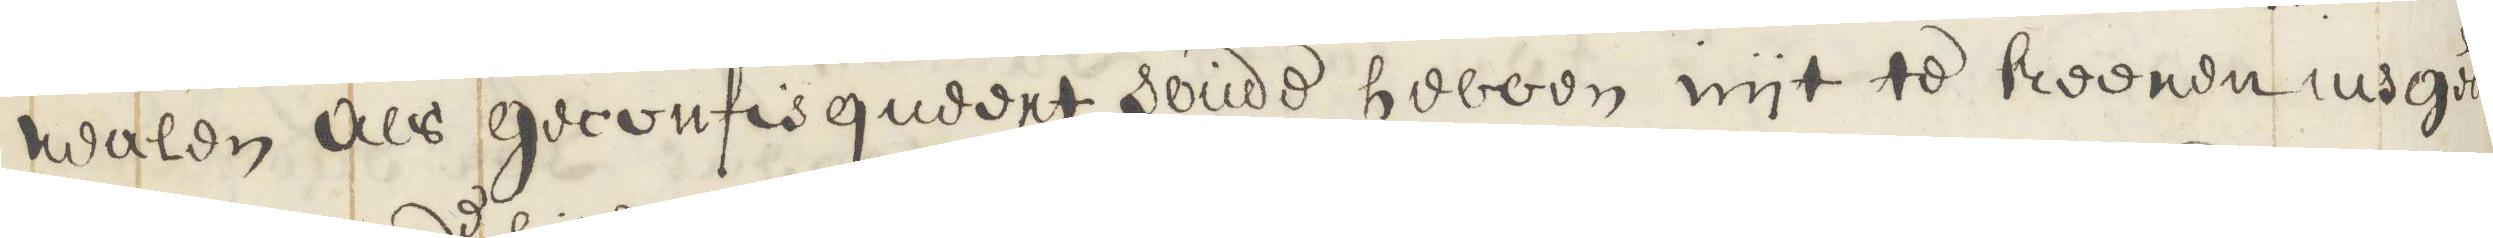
realen als geconfisqueert soude hebben uijt te keeren uitge
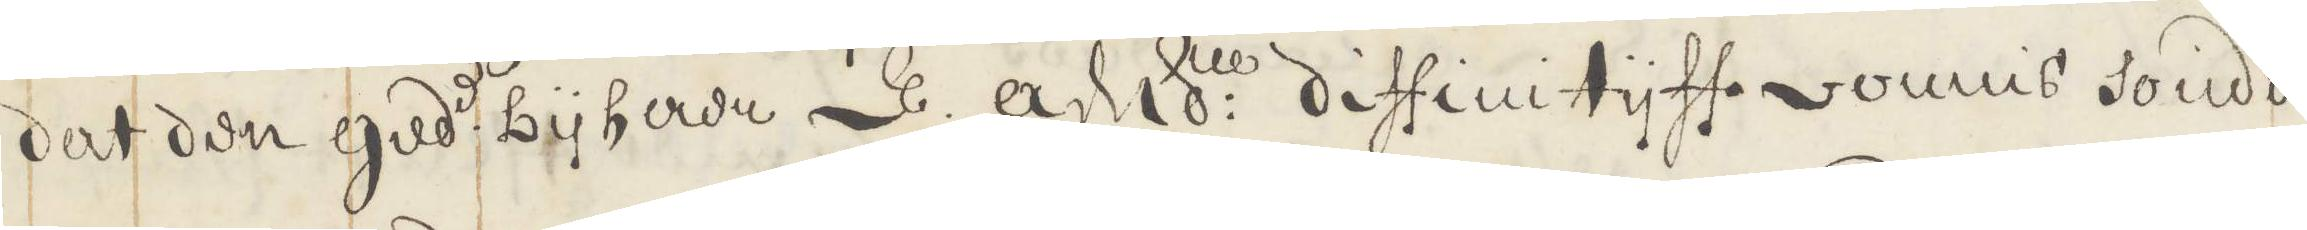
dat den ged:e bij haer E. achtb:re diffinitijff vonnis soude
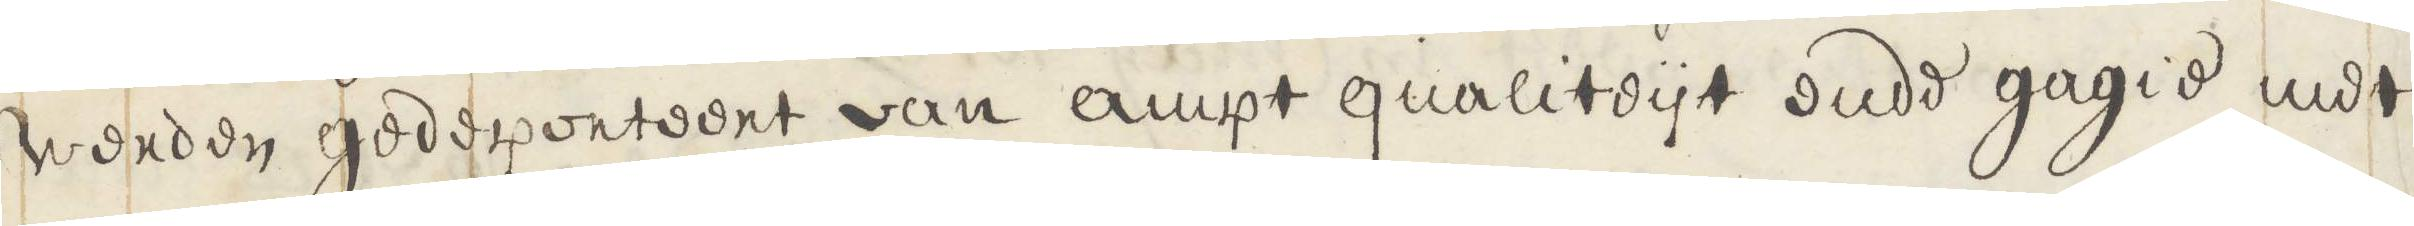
werden gedeporteert van ampt qualiteijt ende gagie met
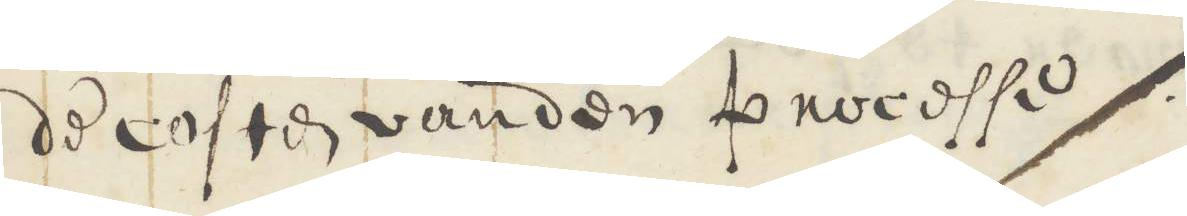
de costen van den processe/.
